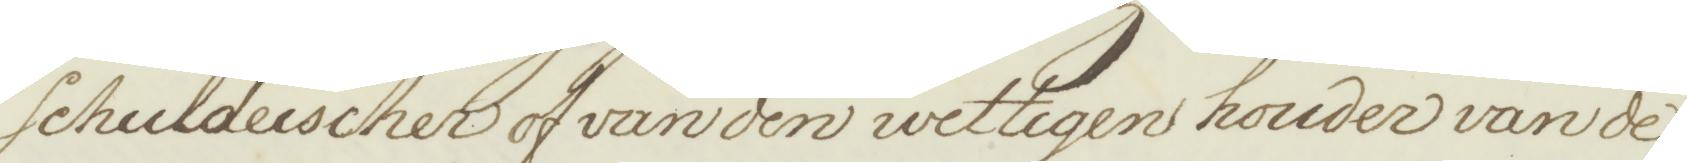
schuldeischer of van den wettigen houder van de
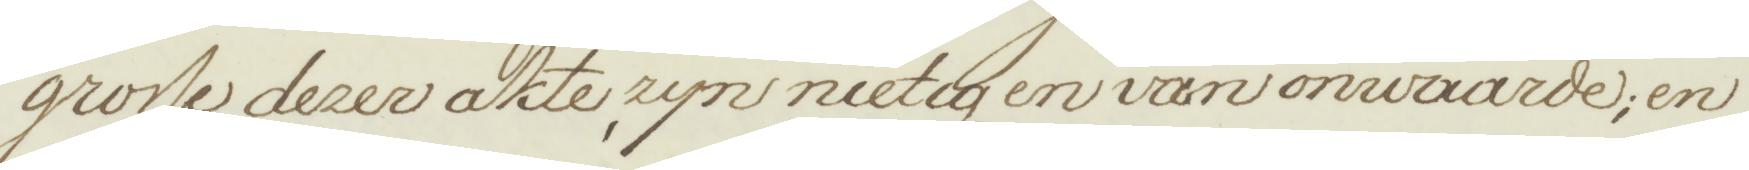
grosse dezer akte, zyn nietig en van onwaarde; en
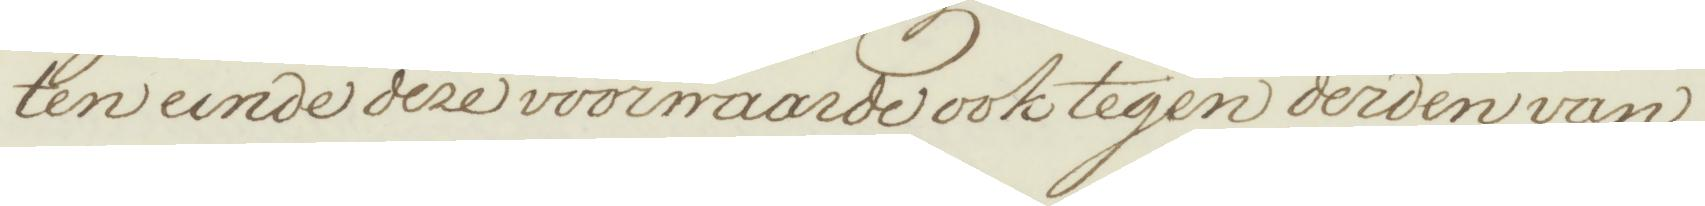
ten einde deze voorwaarde ook tegen derden van
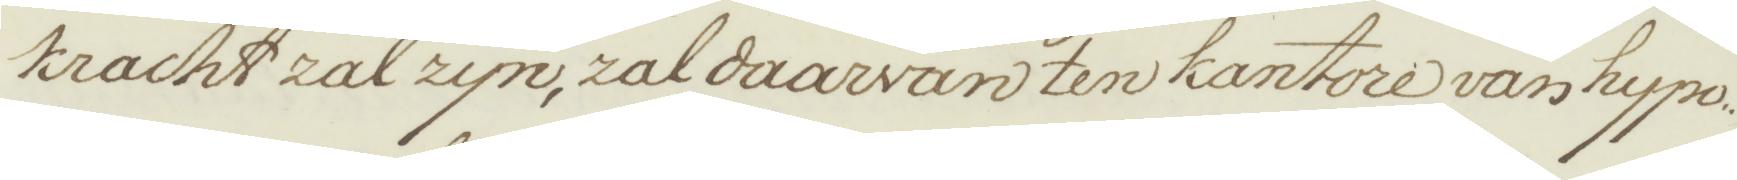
kracht zal zyn, zal daarvan ten kantore van hypo„
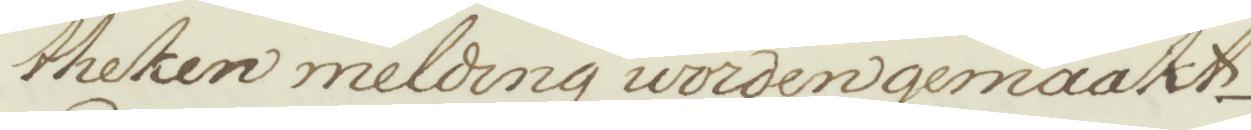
theken melding worden gemaakt-
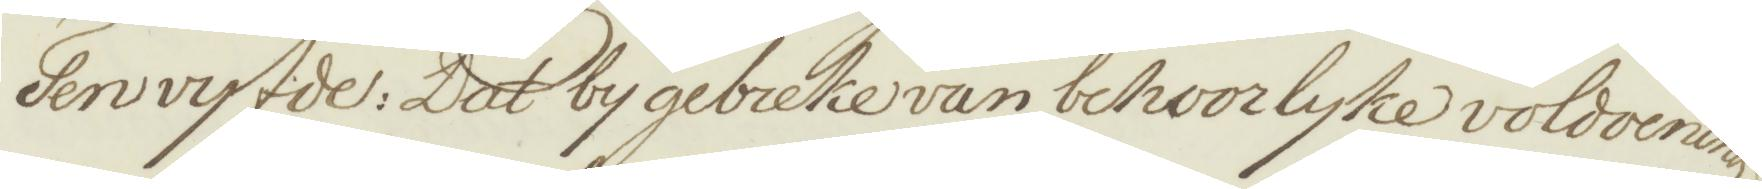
Ten vyfde: Dat by gebreke van behoorlyke voldoening
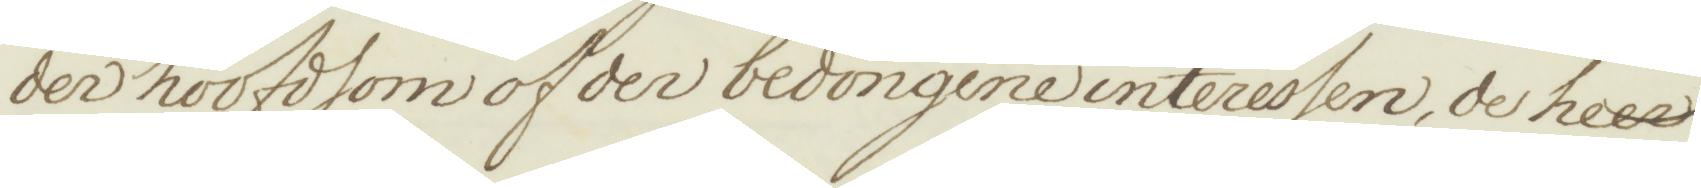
der hoofdsom of der bedongene interessen, de heer
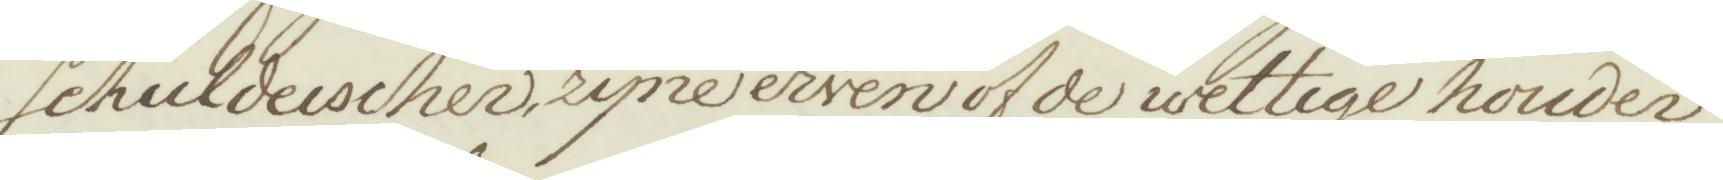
schuldeischer, zyne erven of de wettige houder
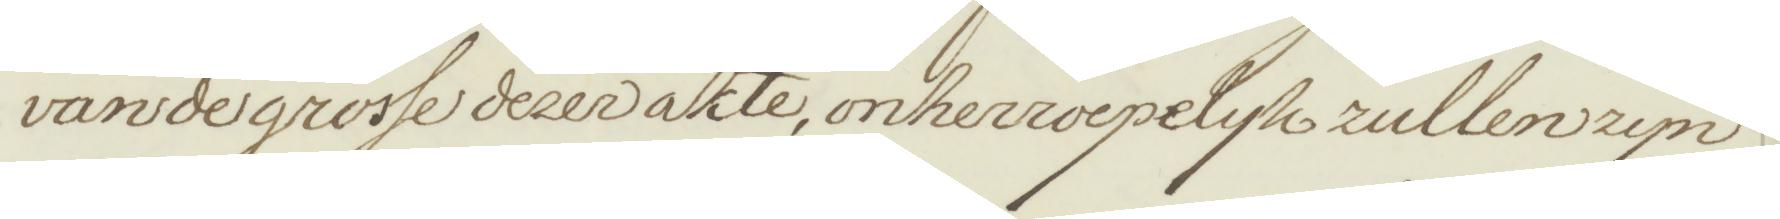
van de grosse dezer akte, onherroepelyk zullen zyn
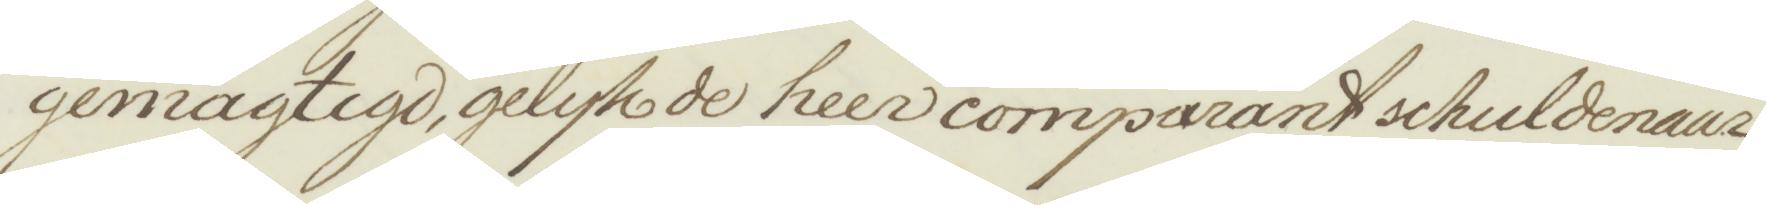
gemagtigd, gelyk de heer comparant schuldenaar,
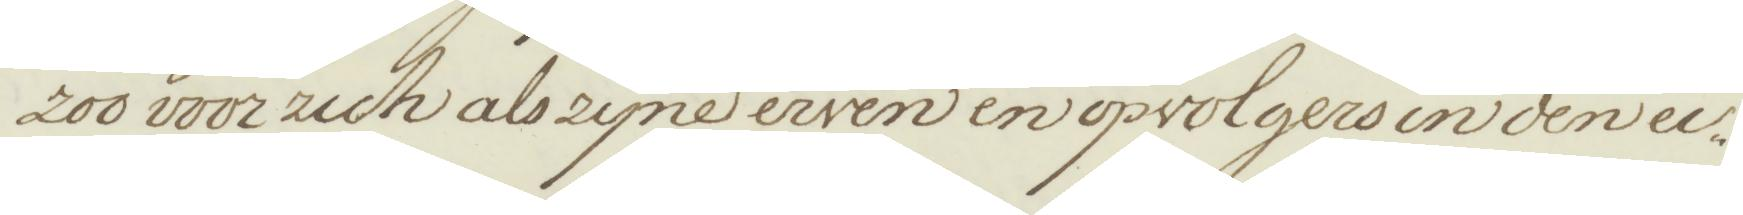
zoo voor zich als zyne erven en opvolgers in den ei„
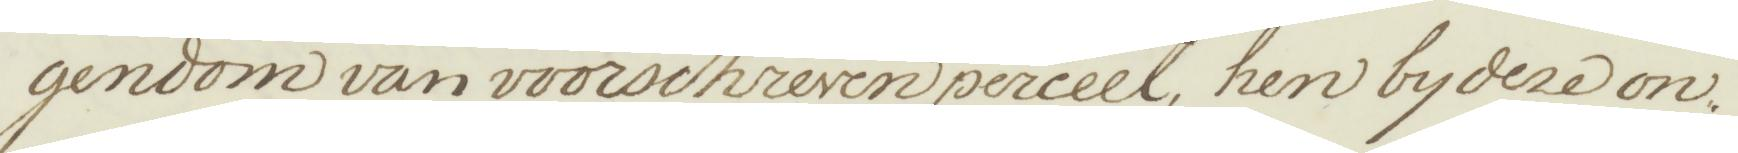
gendom van voorschreven perceel, hen by deze on„
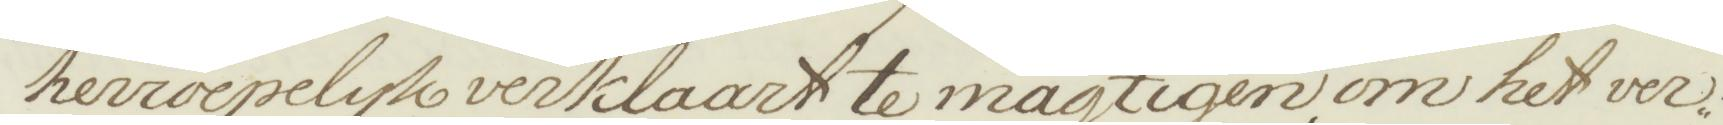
herroepelyk verklaart te magtigen, om het ver„
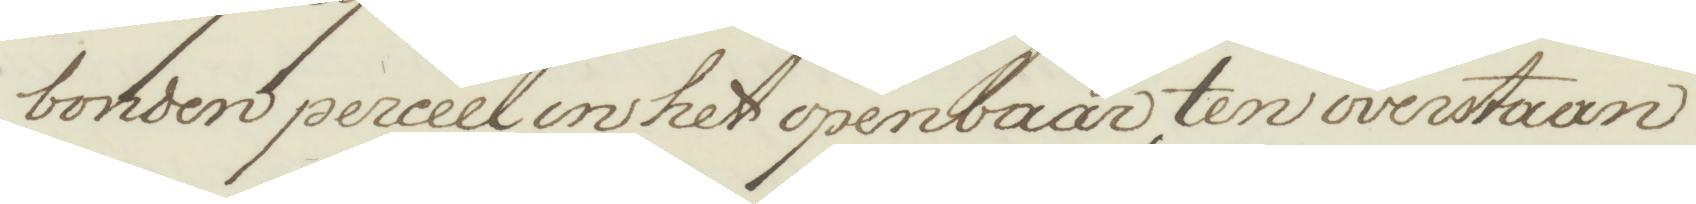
bonden perceel in het openbaar ten overstaan
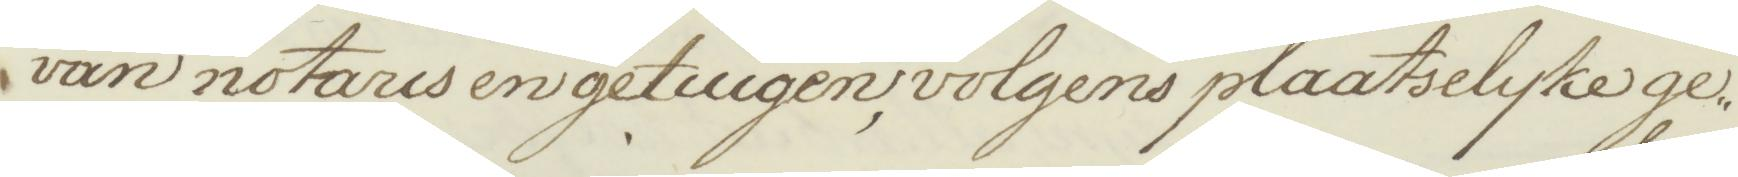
van notaris en getuigen, volgens plaatselijke ge„
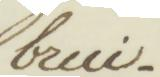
brui-
